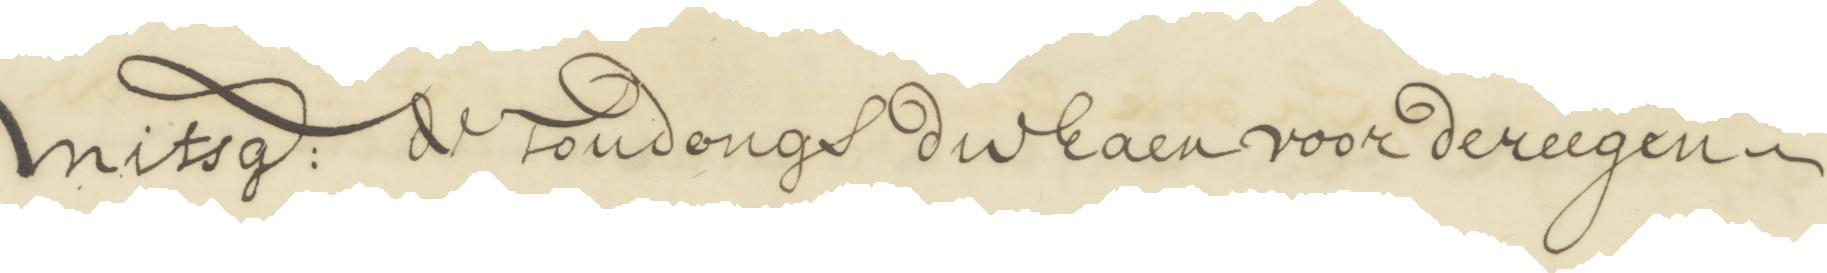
mitsg: de Toudongs die haer voor de reegen
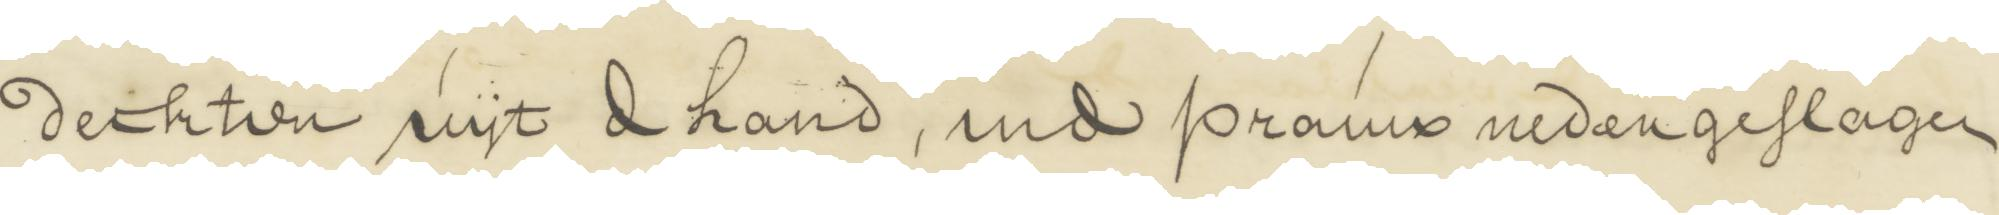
deckten uijt d hand, inde prauw neder geslagen
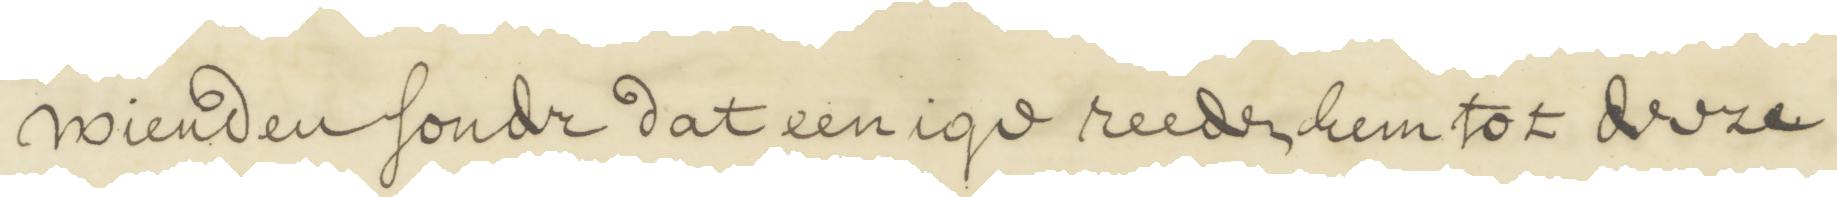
wierden sonder dat eenige reeden hem tot deeze
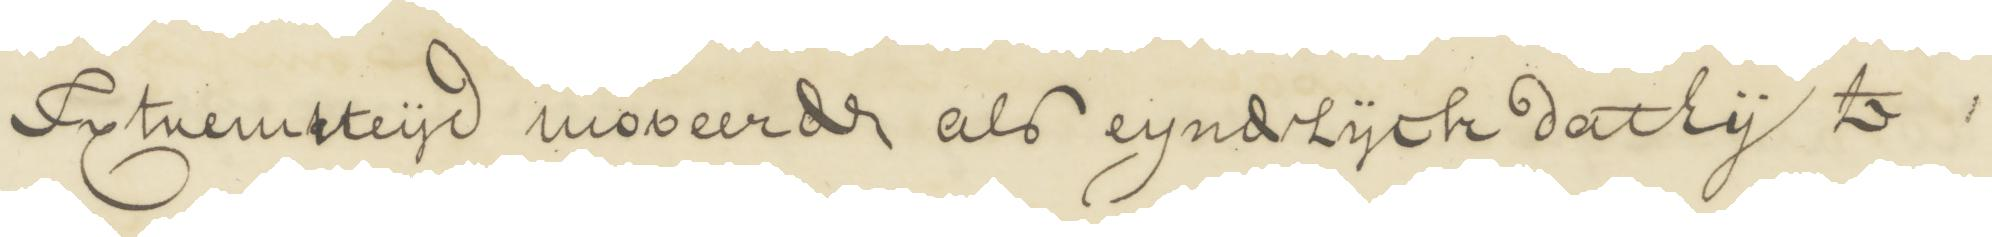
Extremiteijd moveerden als eyndelijck dat hij te
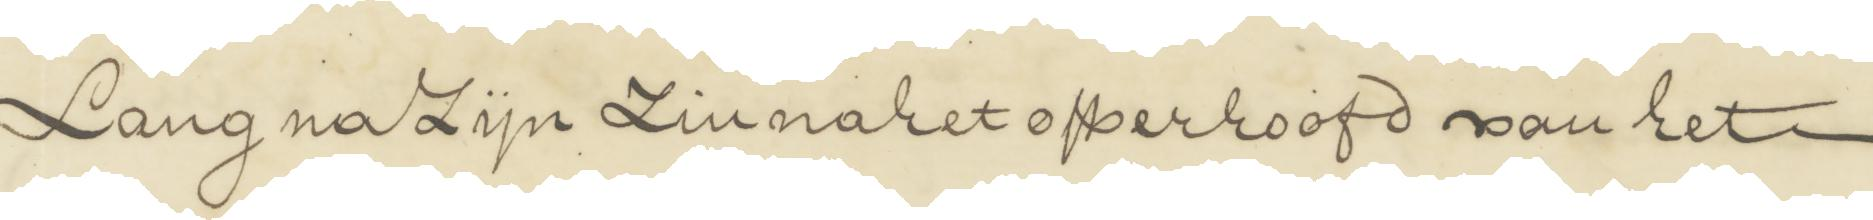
Lang na zijn zin na het opverhoofd van het
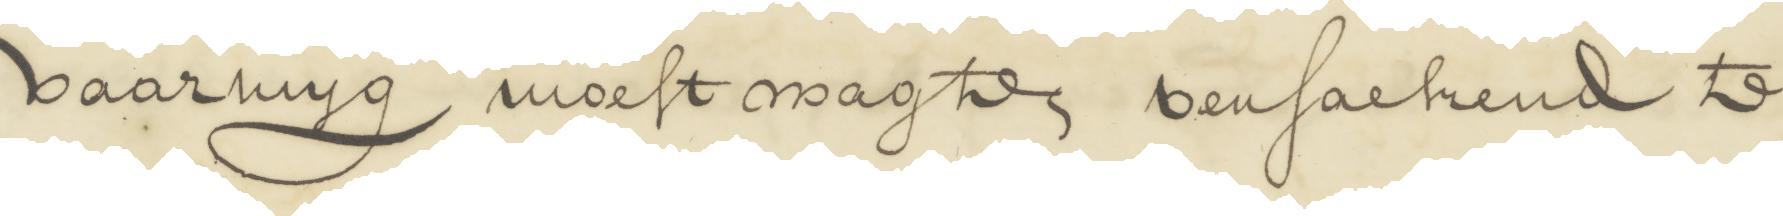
vaartuyg moest wagten versoekende te
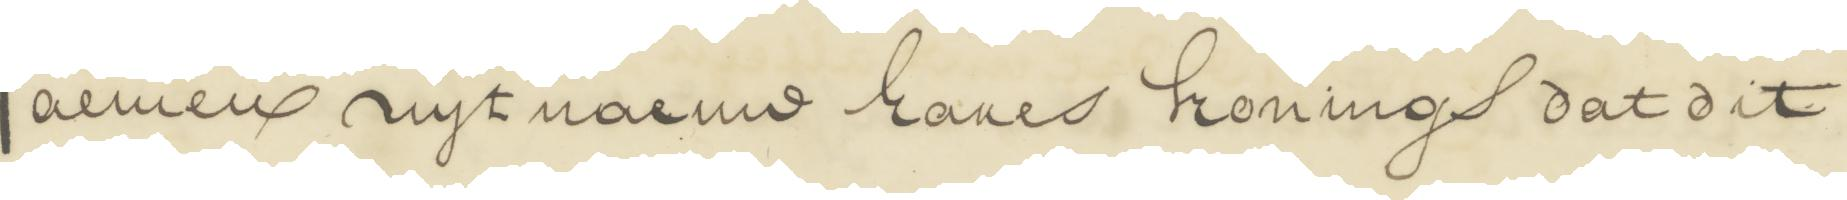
saemen uyt naeme hares konings dat dit
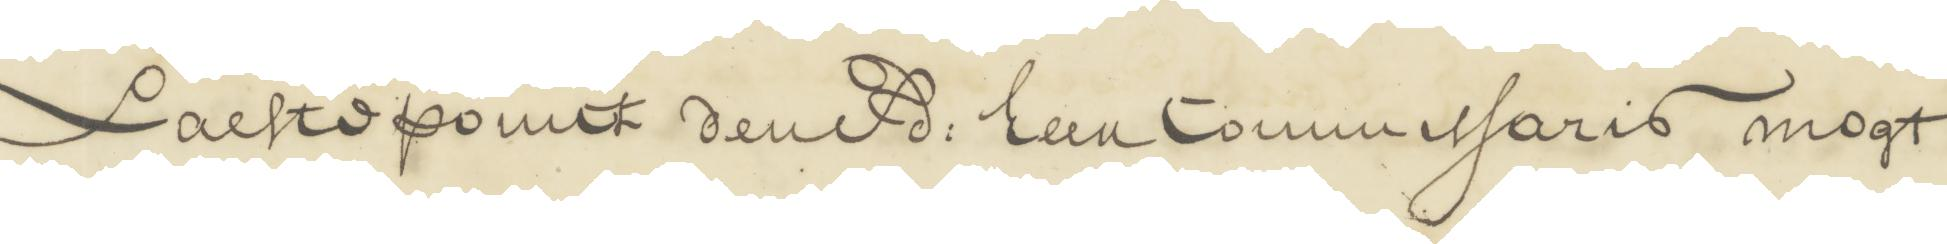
Laeste poinct den Ed: heer Commissaris mogt
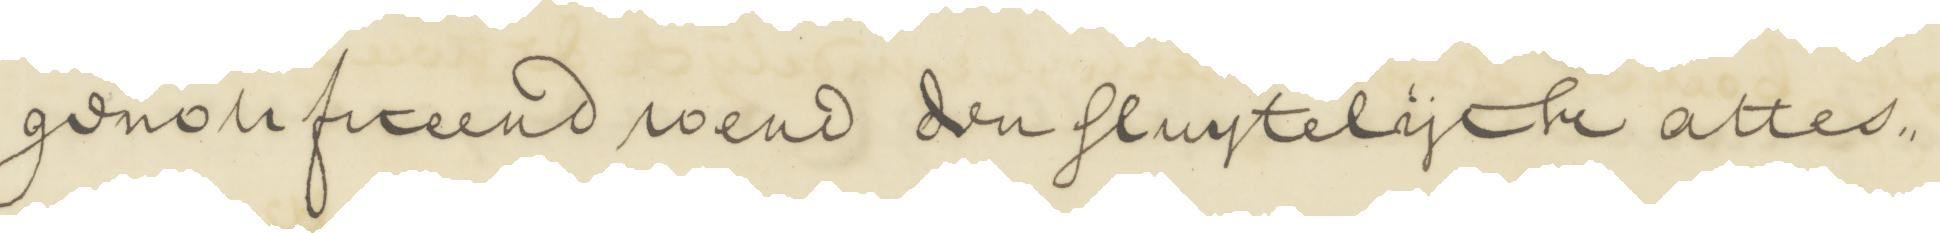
genotificeerd werd den sluytelijck attes„
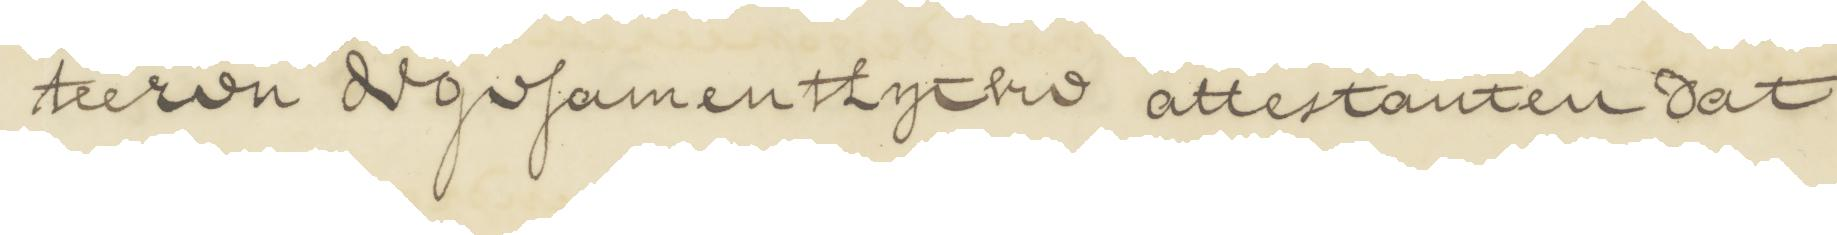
teeren de gesamentlycke attestanten dat
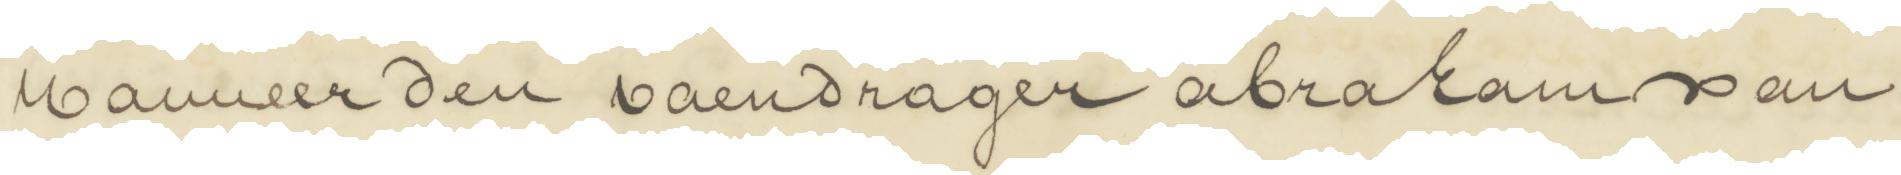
wanneer den vaendrager abraham van
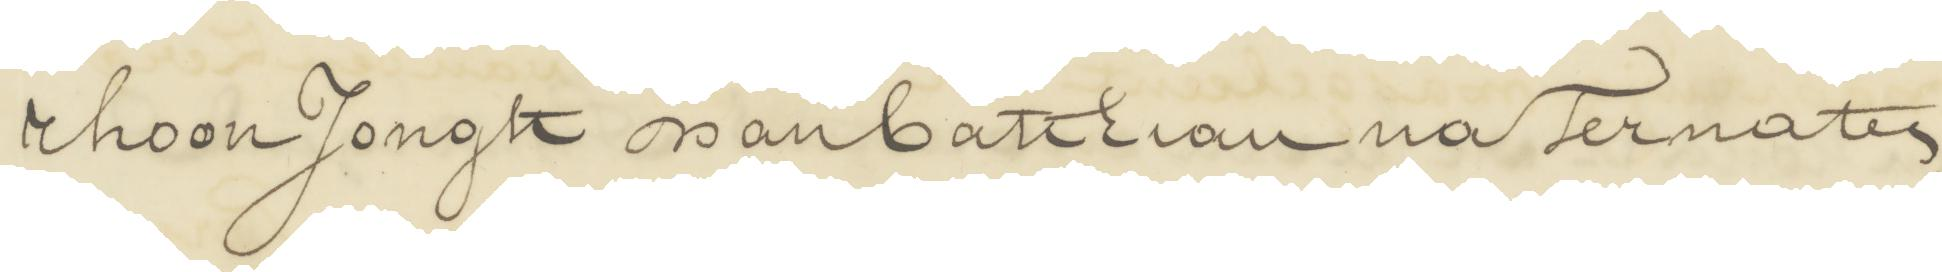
rhoon Jongk van batchian na Ternaten
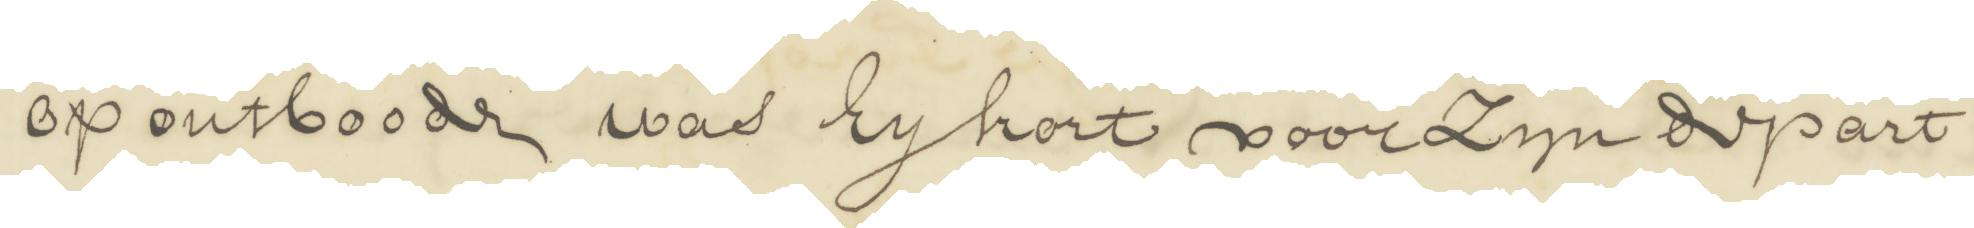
op ontbooden was hy kort voor zyn depart
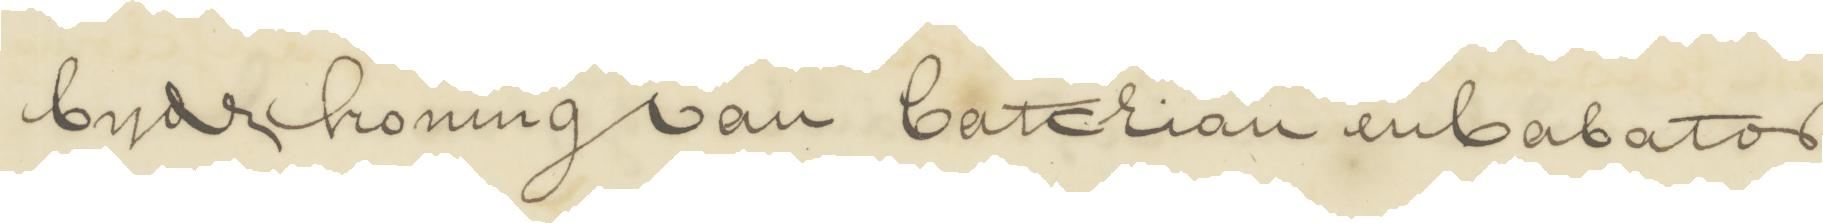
byden koning van batchian en babatos
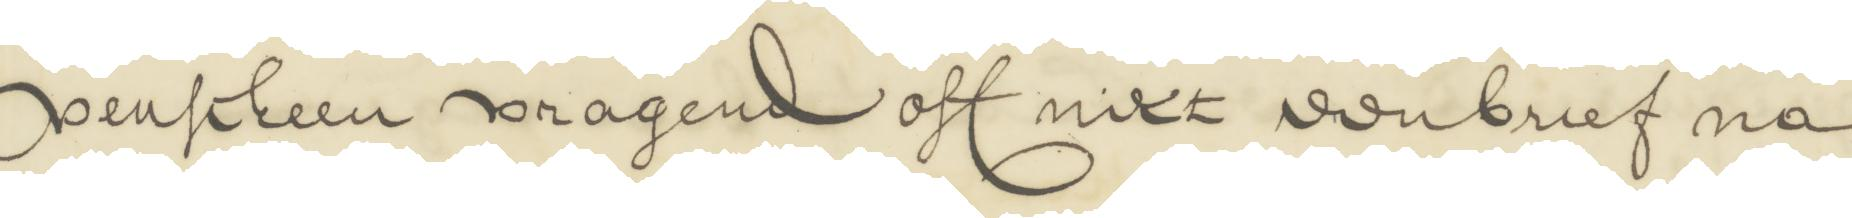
verscheen vragende off niet een brief na
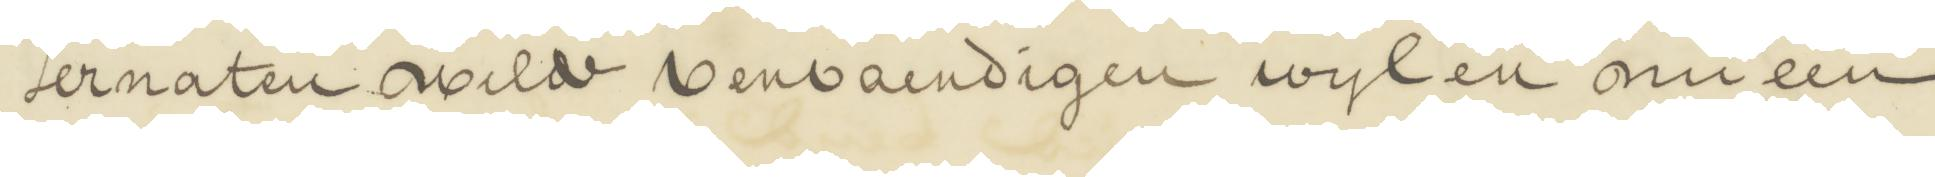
Ternaten wilde vervaerdigen wylen nu een
